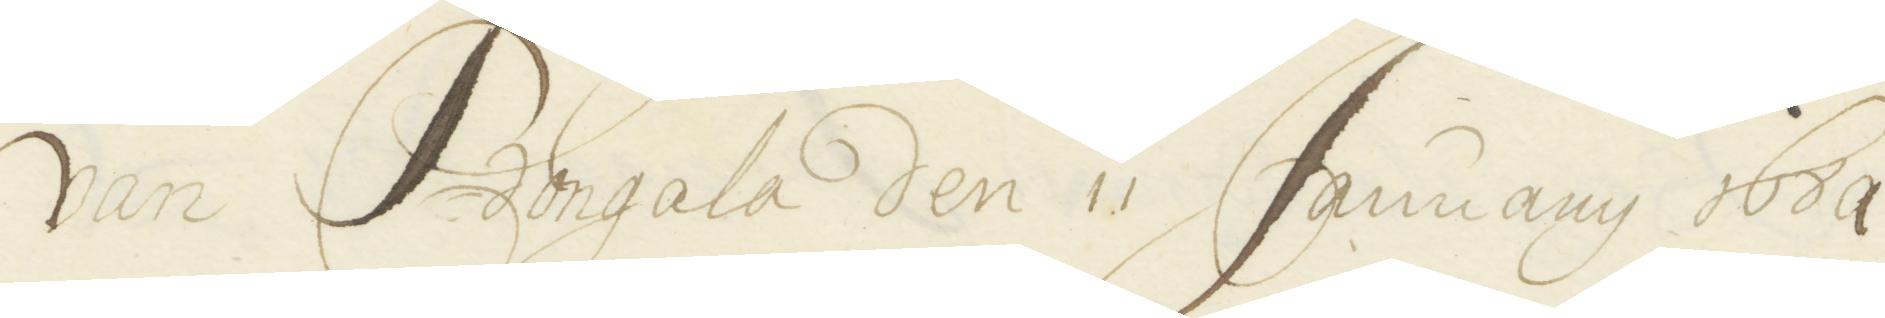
Van Bengala den ii January 1684
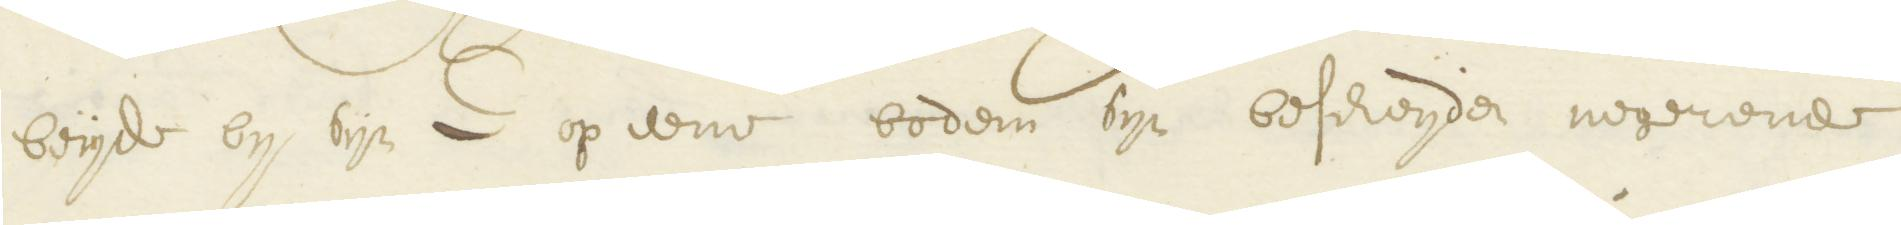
beijde by sijn E op eene bodem syn bescheijden negerende
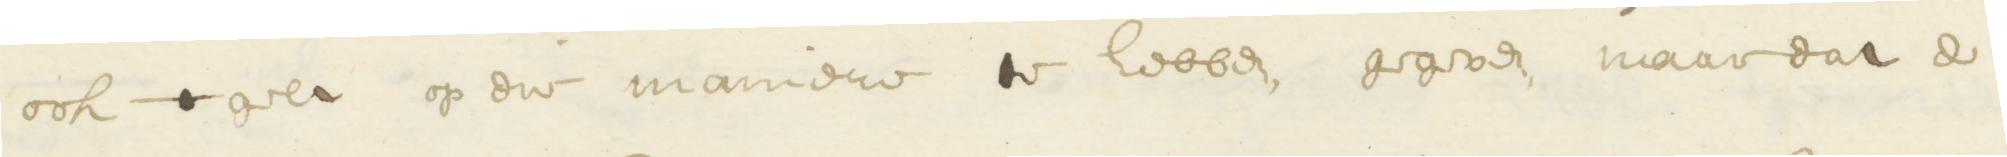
ook tgelt op die maniere te hebben gegeven, maar dat de
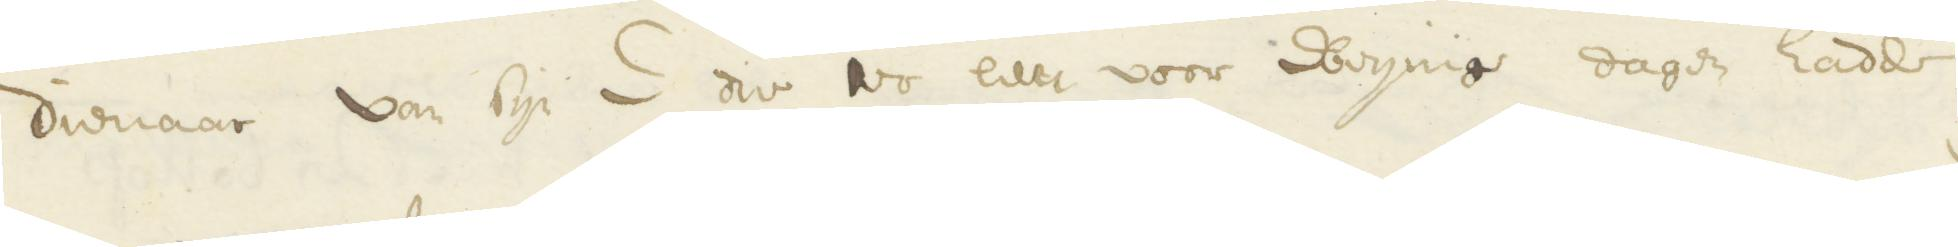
dienaar van sijn E die ter eelt voor weijnige dagen hadde
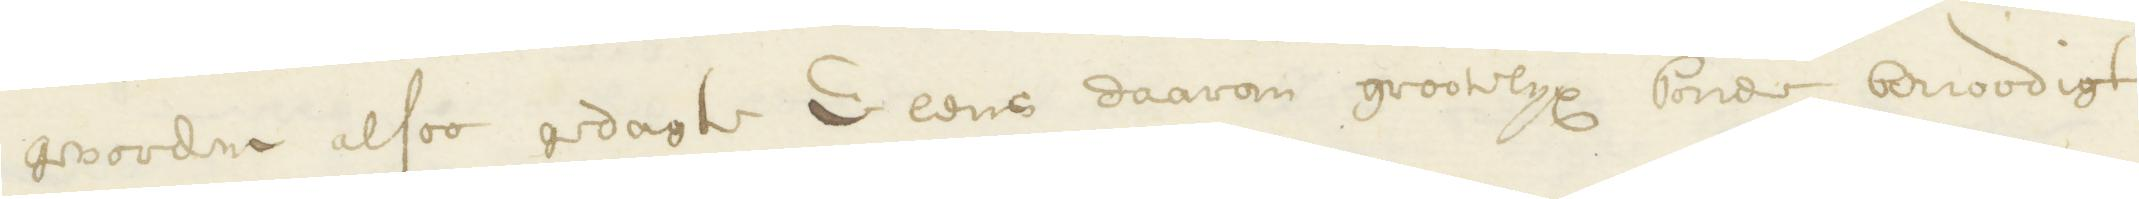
gevordert alsoo gedagte E eens daarom grootelijx soude benoodigt
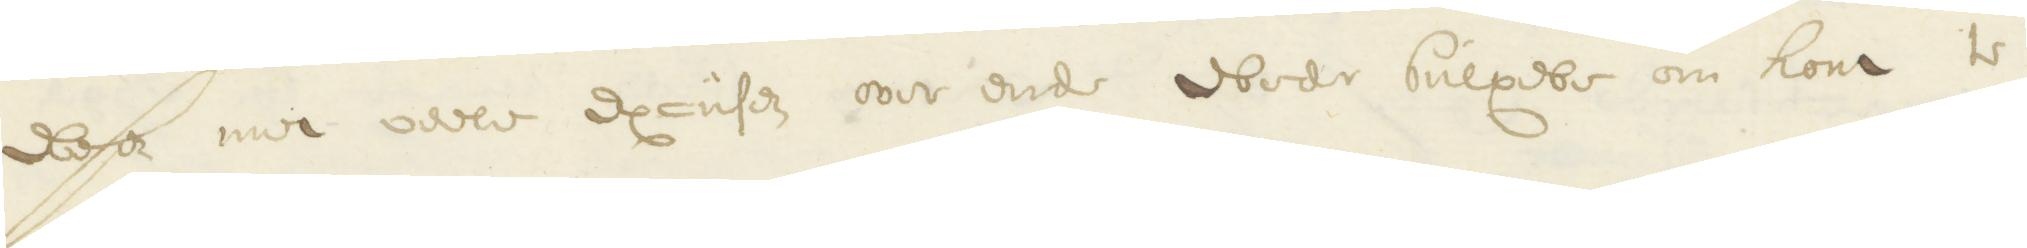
wesen met veele excusen over ende weder sulxese om kort te
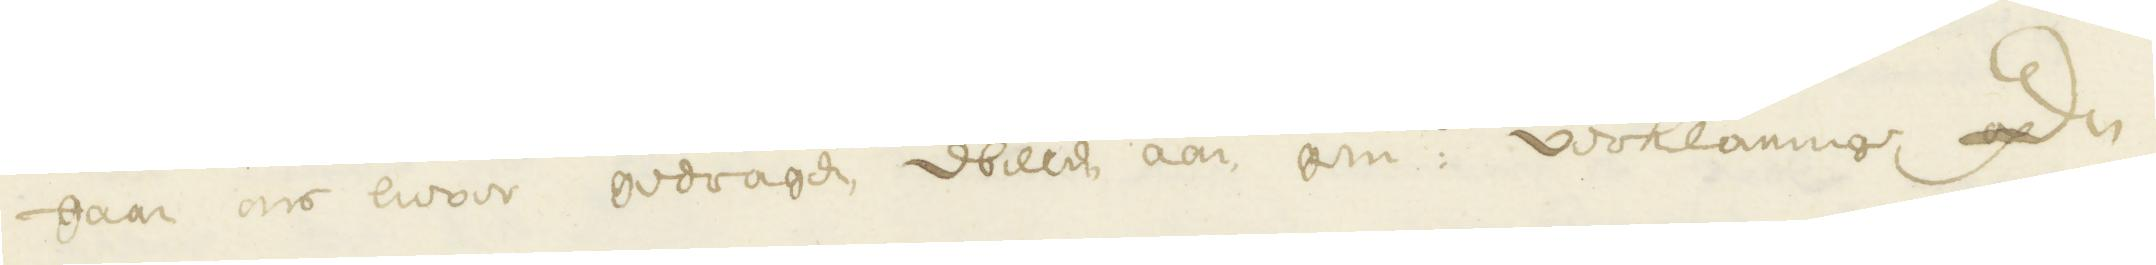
gaan ons liever gedragen willen aan gem:' verklaringe, En
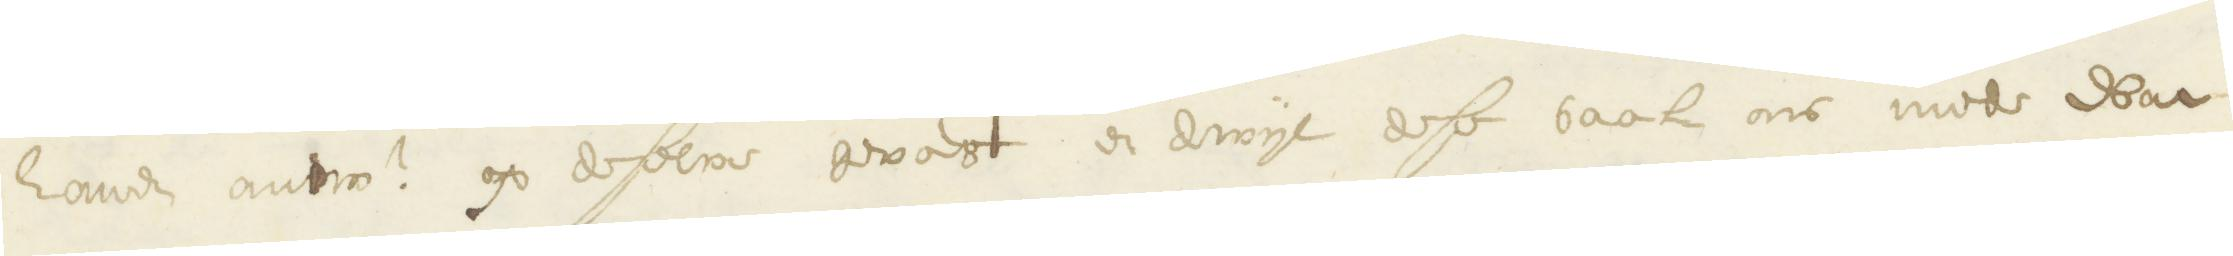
haren antw.t op deselve gevoegt en dewijl dese saak ons mede wat
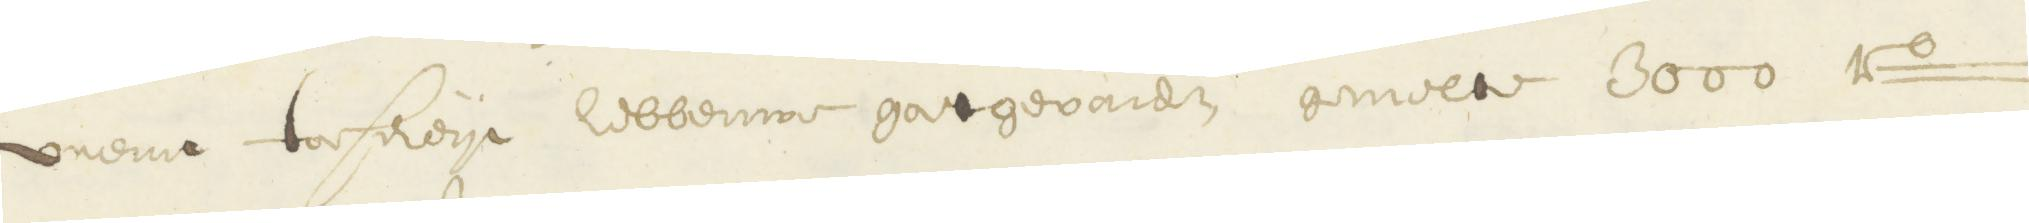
vremt toescheijt hebbenwe goetgevonden gemelte 3000 r=o
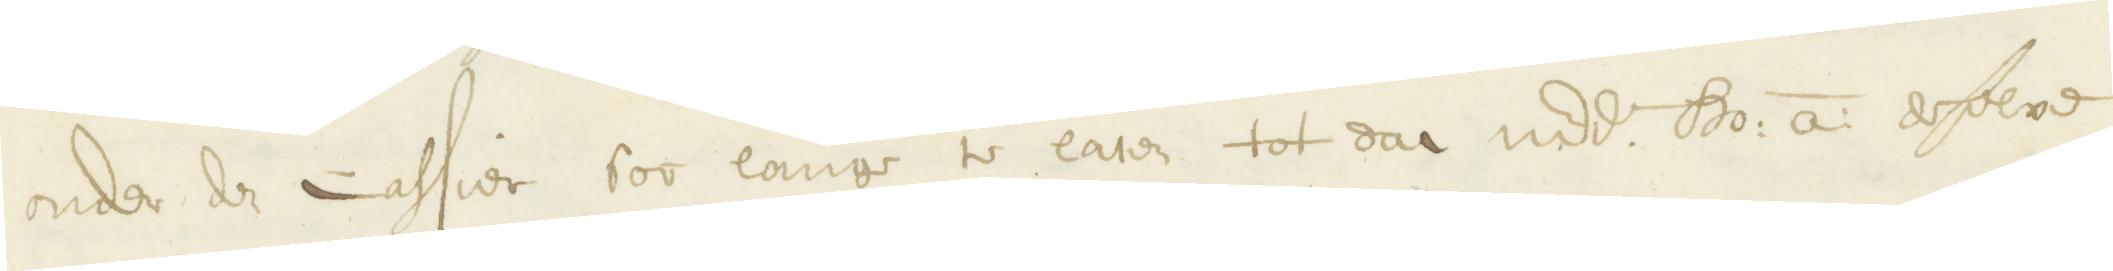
onder den Cassier soo lange te laten tot dat uEd: Ho: a: deselve
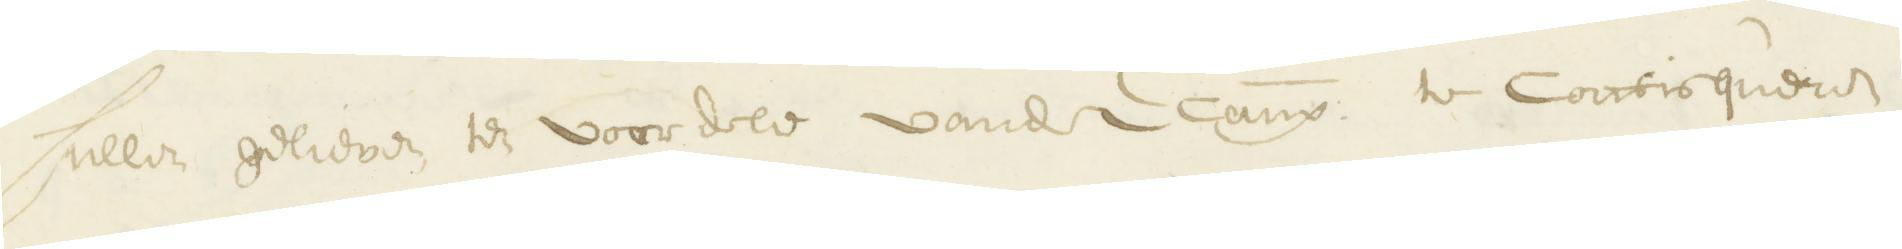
sullen gelieven ten voordele vand EComp: te Confisqueren
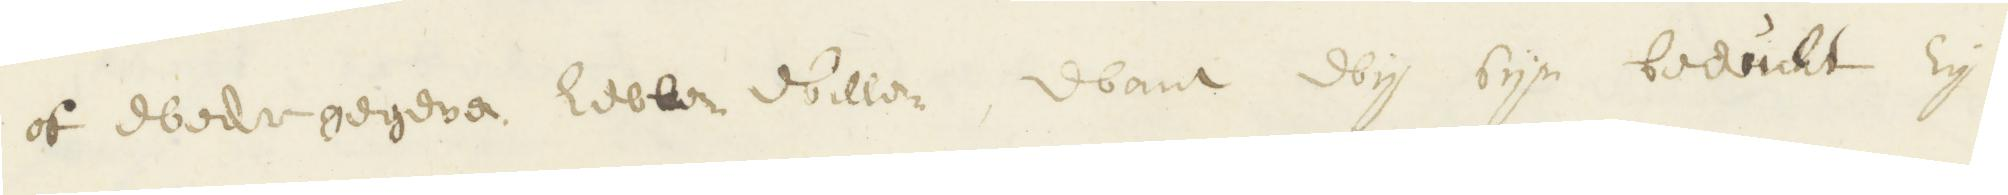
of weder gegeven hebben willen, want wij sijn beducht hij
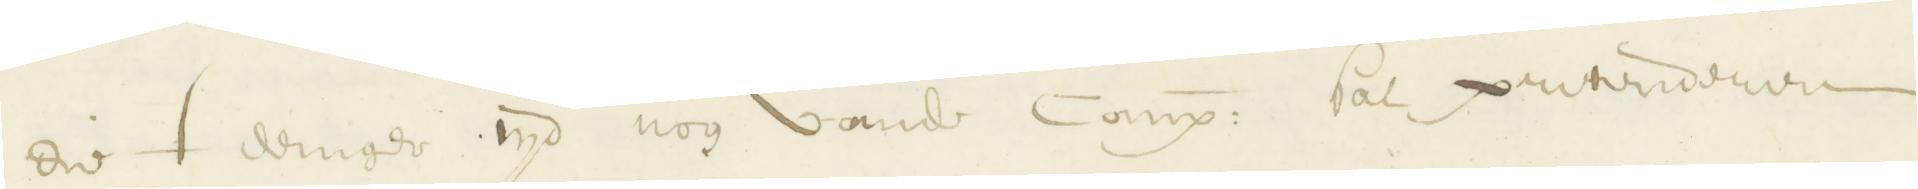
die ’t eeniger tijd nog vande Comp: sal pretenderen
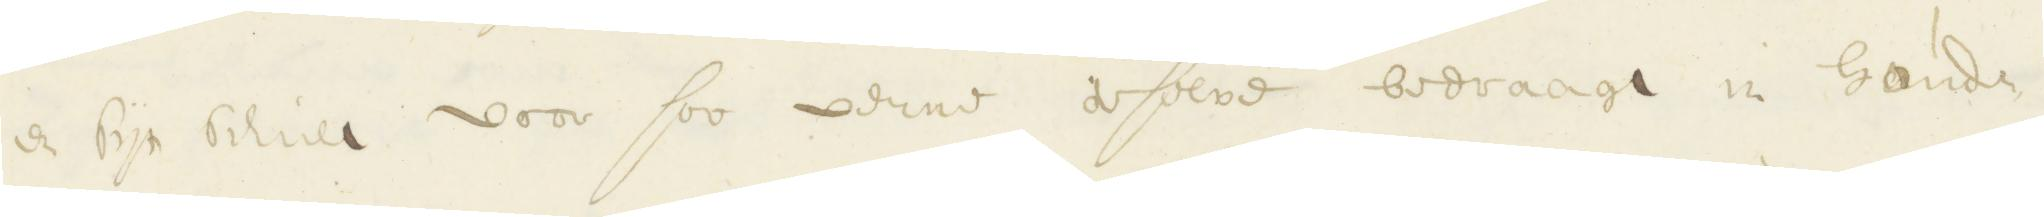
en sijn schult voor soo verre deselve bedraagt in houden
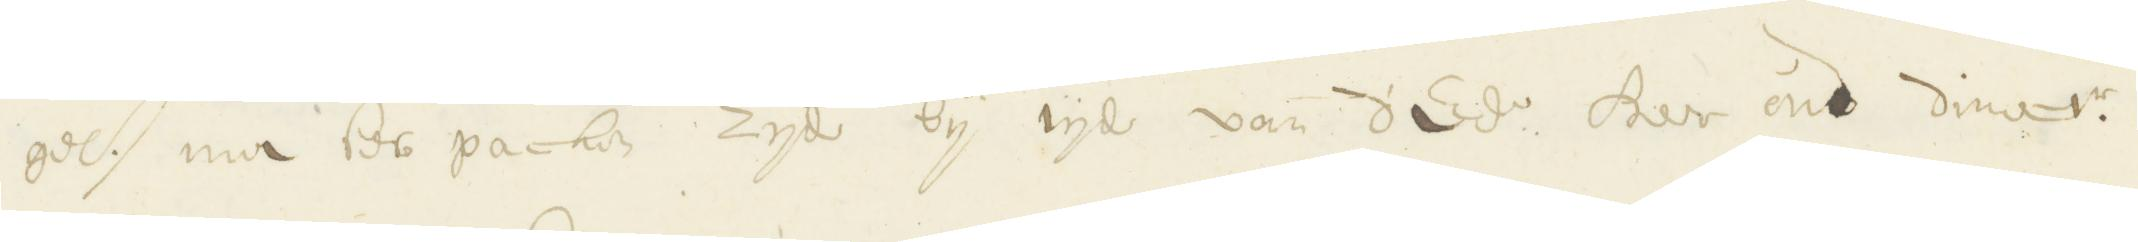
gelijk met ses packen zijde bij tijde van d’Ed:e Heer oud direct.r
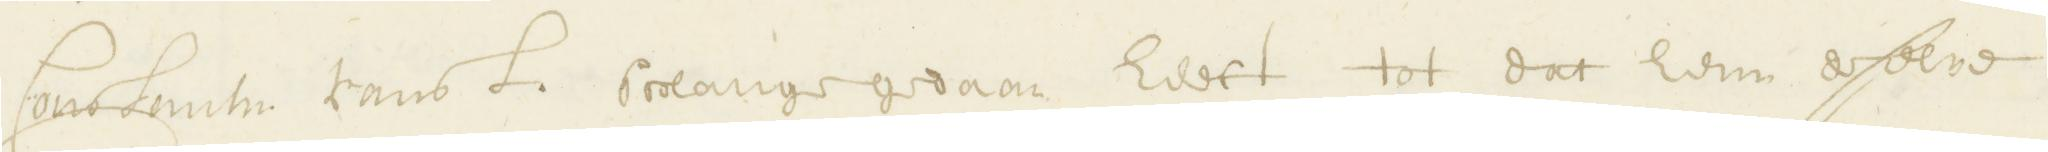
Constantin kanst. soolange gedaan heeft tot dat hem deselve
